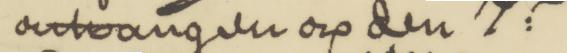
ontvangen op den 7:'
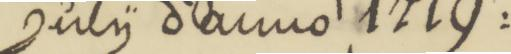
julij d' anno 1719:
